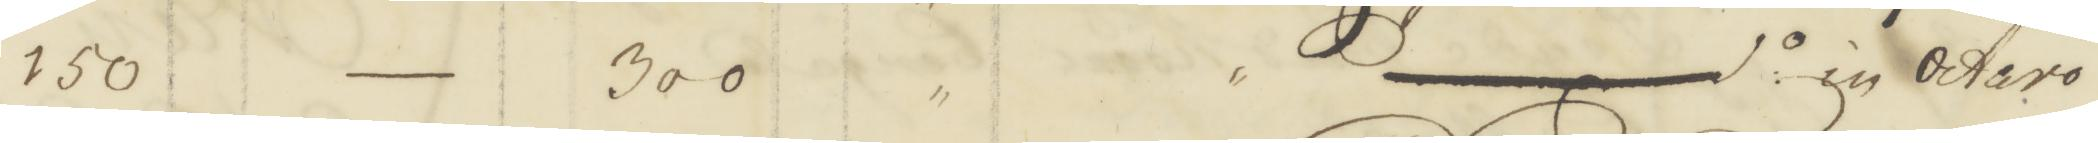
150 — 300 „ „ _:o in Octavo
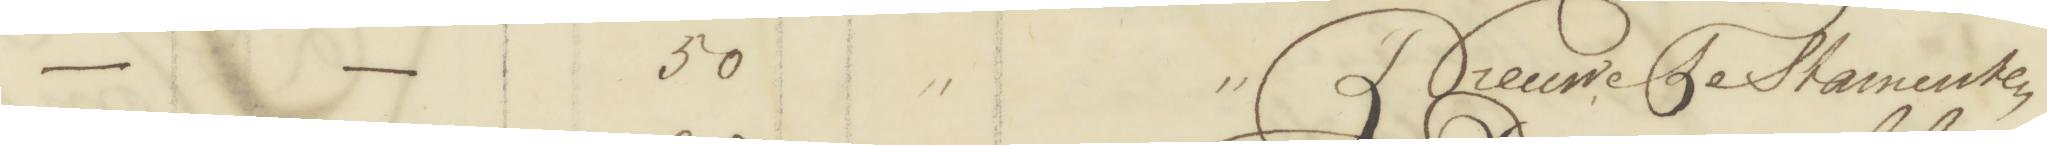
— — 50 „ „ Nieuwe Testamenten
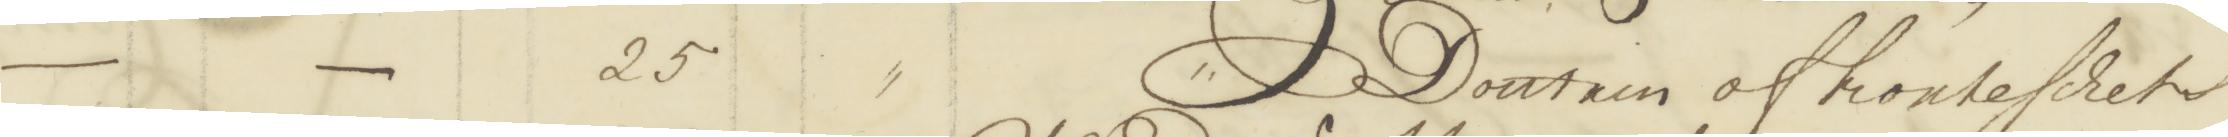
— — 25 „ „ Doutrin of korte schets
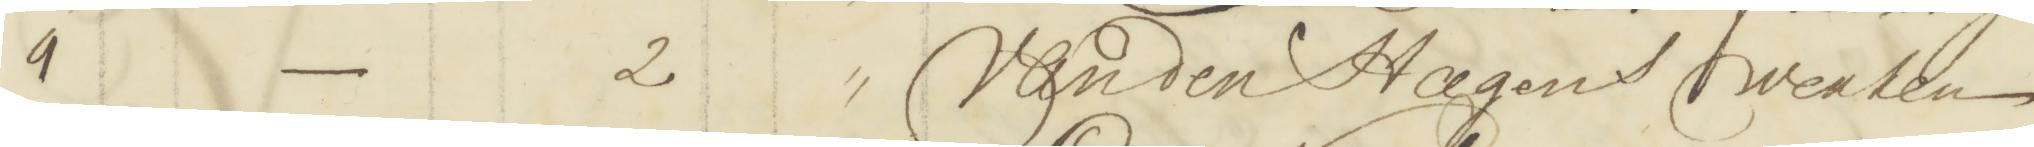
4 — 2 „ Van den Hagens werken
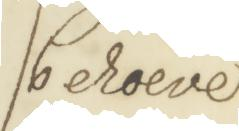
behoeve
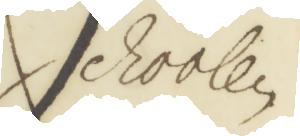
Schoolen
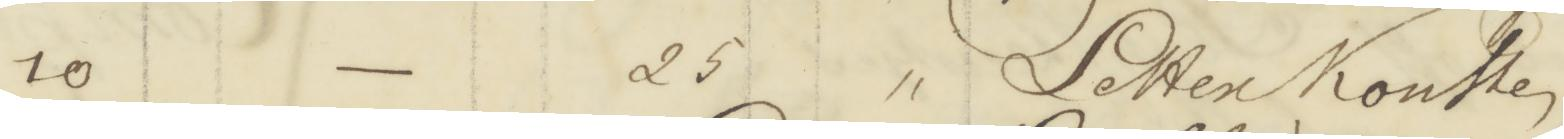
10 — 25 „ Letter Konsten
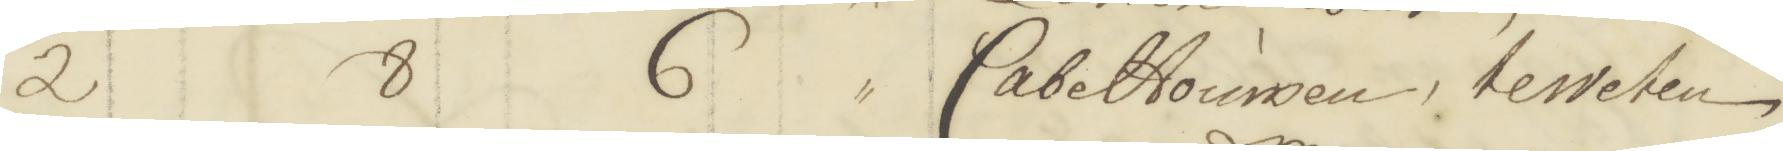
2 8 6 „ Cabeltouwen, te weten
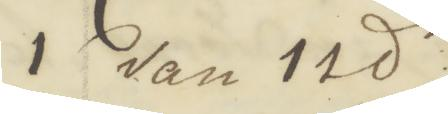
1 van 11 d:m
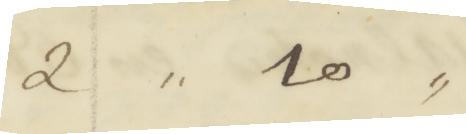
2 „ 10 „
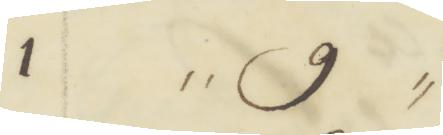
1 „ 9 „
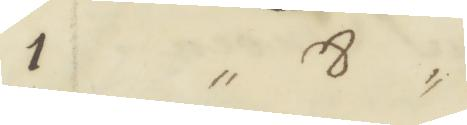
1 „ 8 „
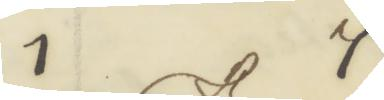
1 „ 7
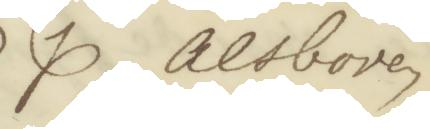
6 p:s als boven
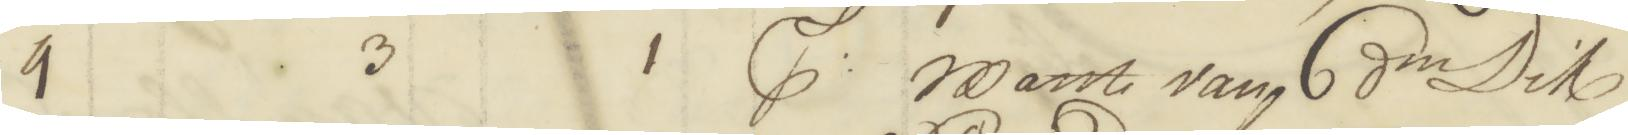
4 3 1 p:s want van 6 d:m Dik
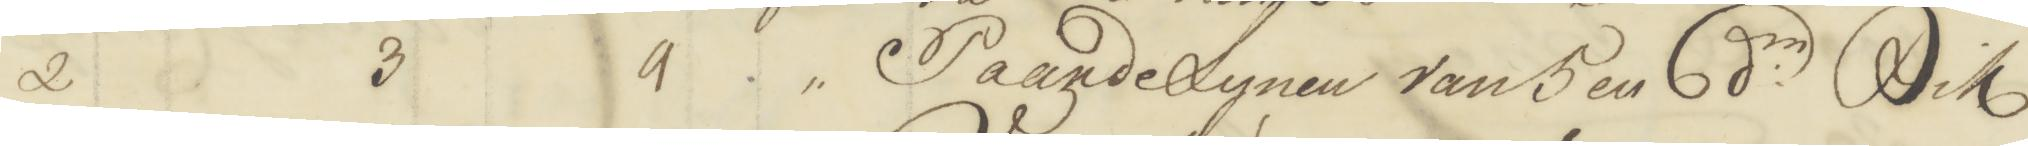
2 3 4 „ Paardelynen van 5 en 6 d:m Dik
